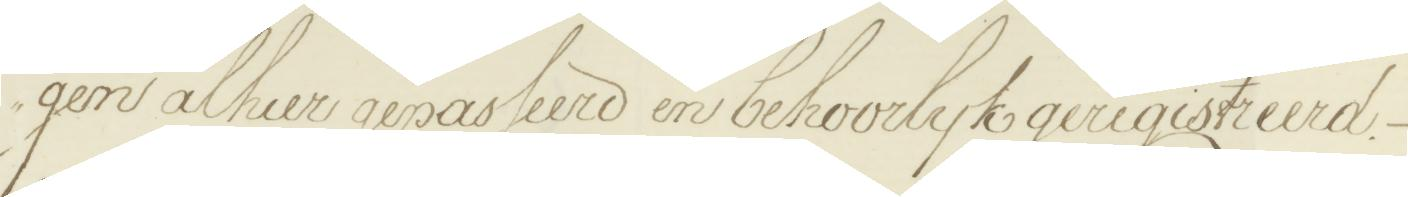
„gen alhier gepasseerd en behoorlyk geregistreerd.
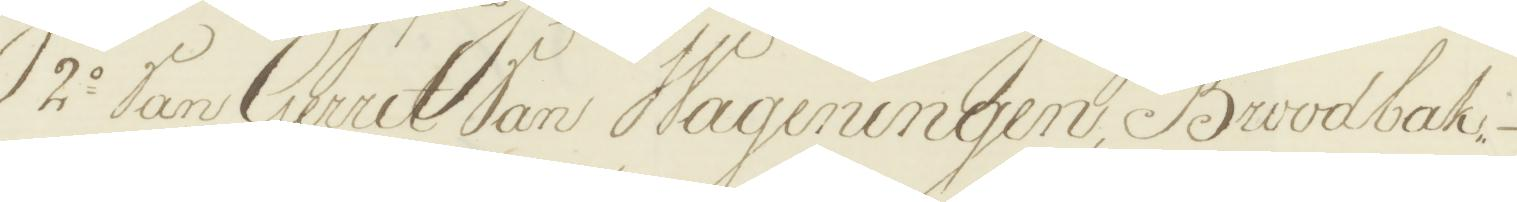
2:o Van Gerrit Van Wageningen, Broodbak„
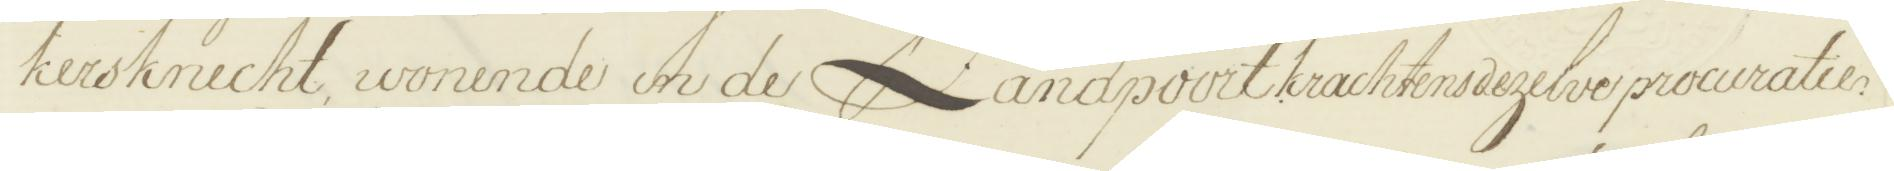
kersknecht, wonende in de Zandpoort krachtens dezelve procuratie.
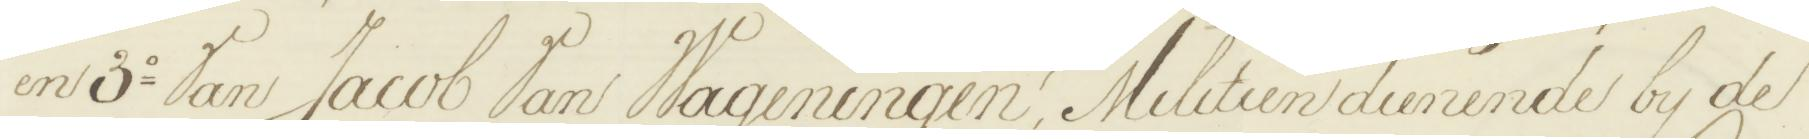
en 3=o Van Jacob Van Wageningen, Militien dienende by de
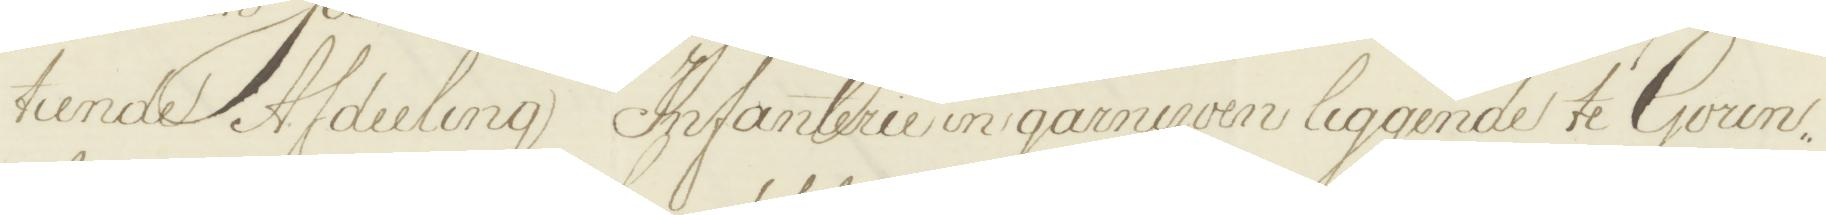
tiende Afdeeling Infanterie in garnizoen leggende te Gorin„
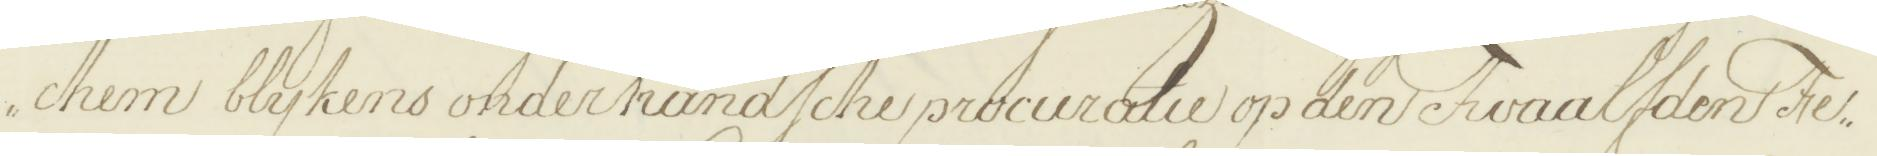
„chem blykens onderhandsche procuratie op den Twaalfden Fe„
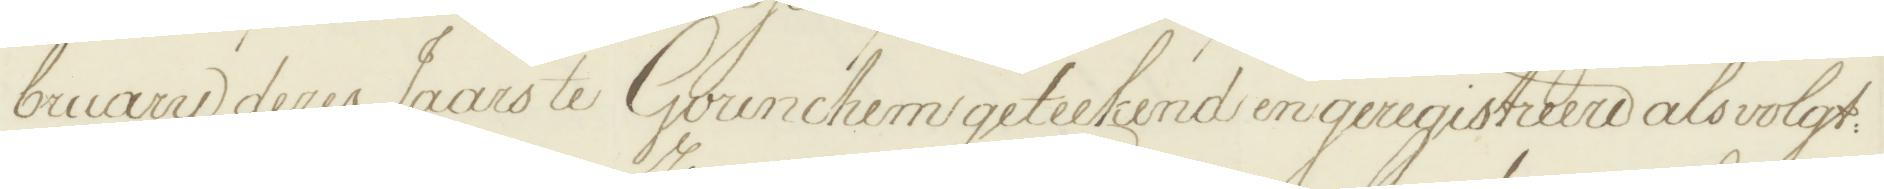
bruary dezes Jaars te Gorinchem geteekend en geregistreerd als volgt:
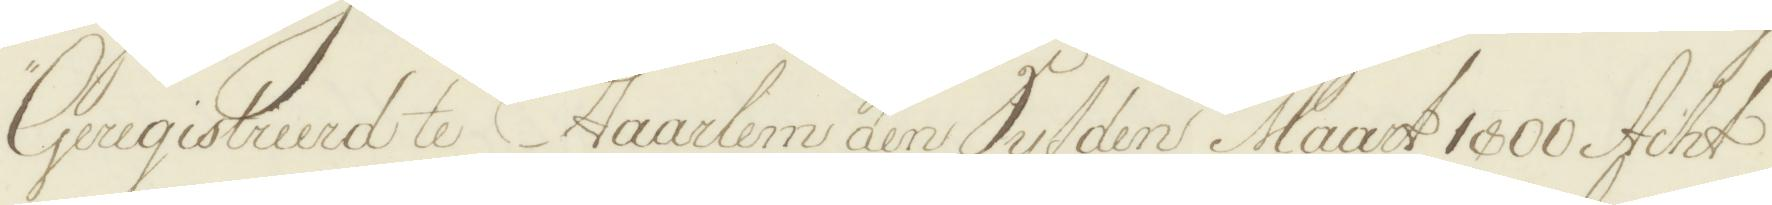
”Geregistreerd te Haarlem den Vyfden Maart 1800 Acht
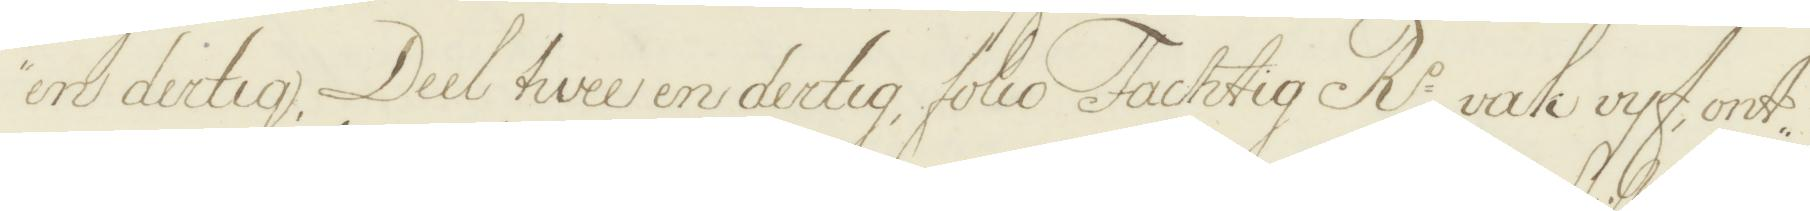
”en dertig, Deel twee en dertig, folio Tachtig R:o vak vyf ont„
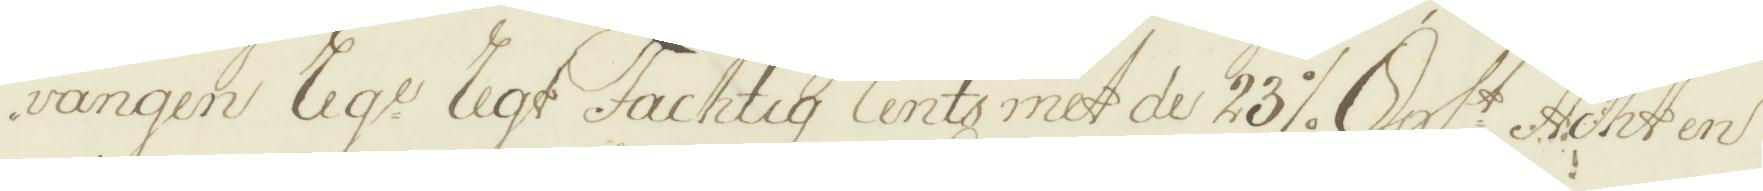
”„vangen Reg= Regt Tachtig Cents met de 23%. OpC:t Acht en
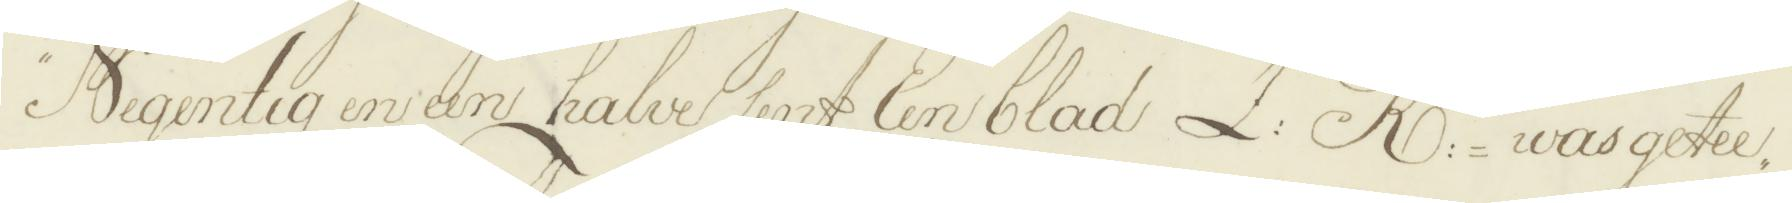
”Negentig en een halve Cent Een blad Z: R:=was getee„
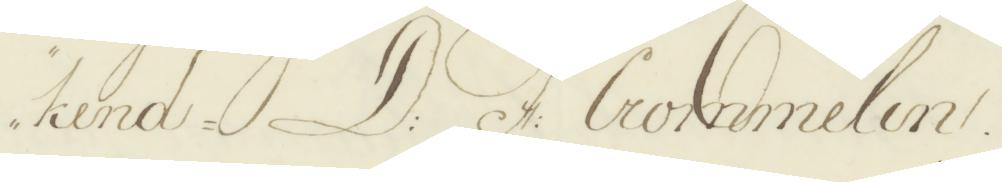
”„kend D: F: Crommelin.
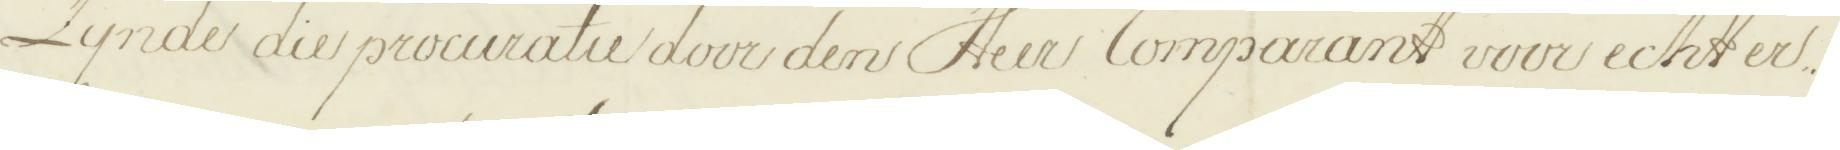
Zynde die procuratie door den Heer Comparant voor echt er„
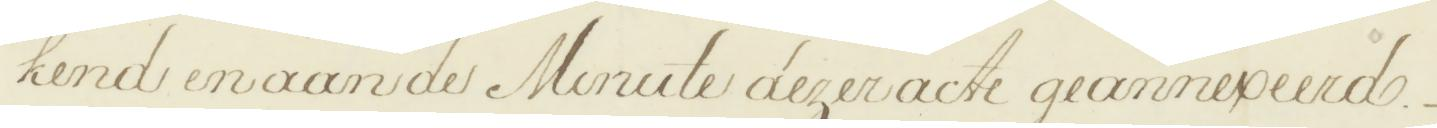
kend en aan de Minute dezer acte geannexeerd.
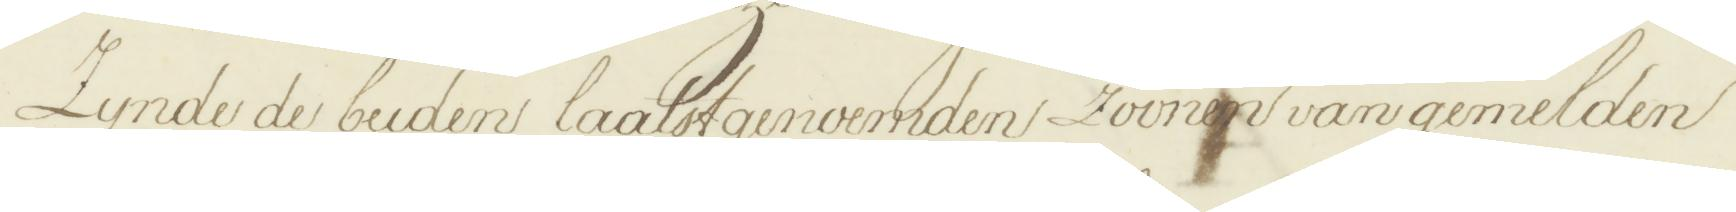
Zynde de beiden laatstgenoemden zoonen van gemelden
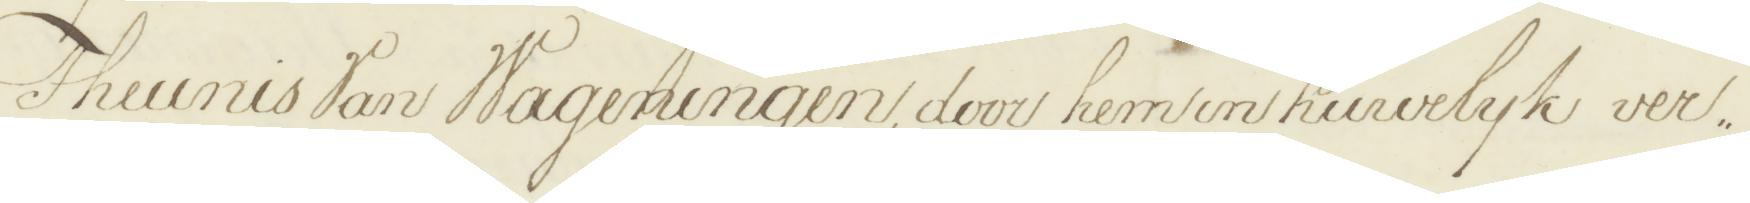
Theunis Van Wageningen, door hem in huwelyk ver„
